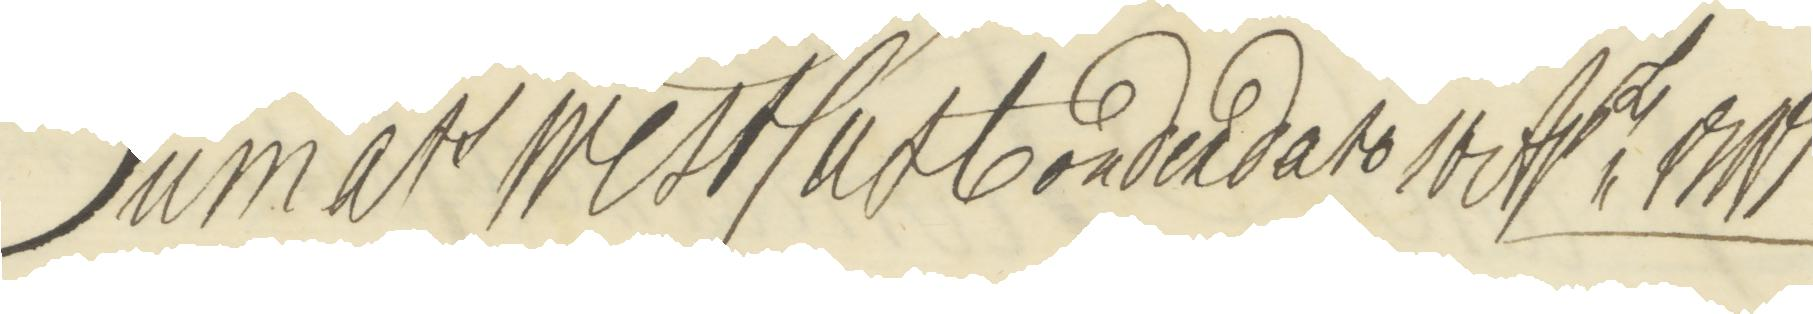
Van Sumats West Cust onderdato 10 Ap„l 1747
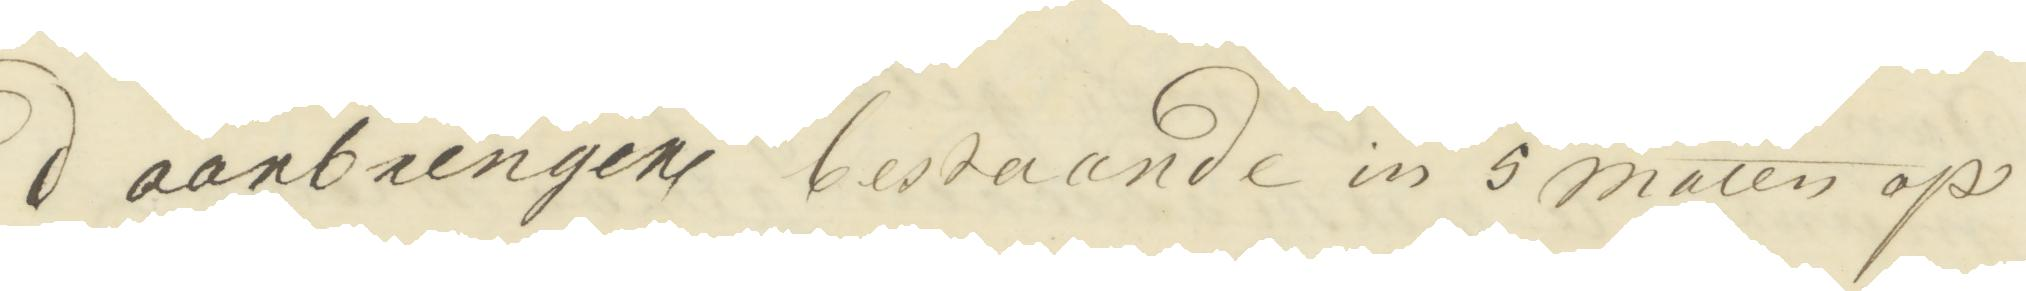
d aanbrengen bestaande in 5 maten op
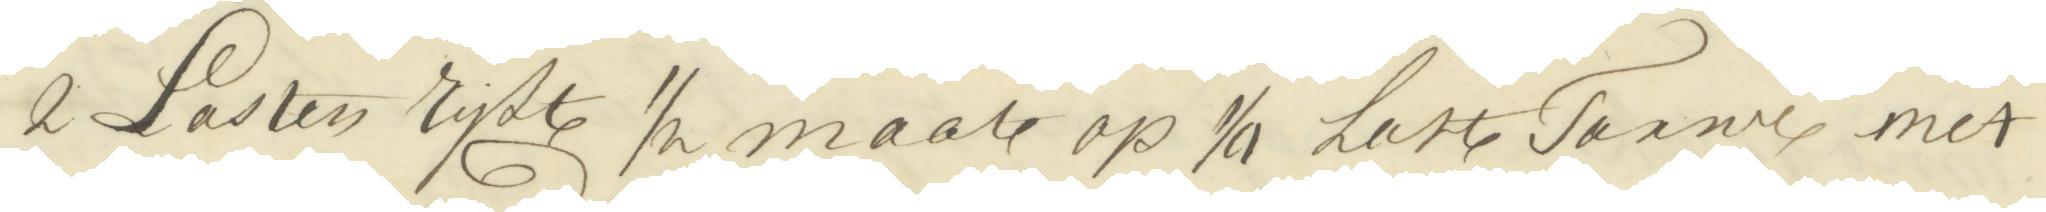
2 Lasten rijst ½ maat op ¼ last Tarwe met
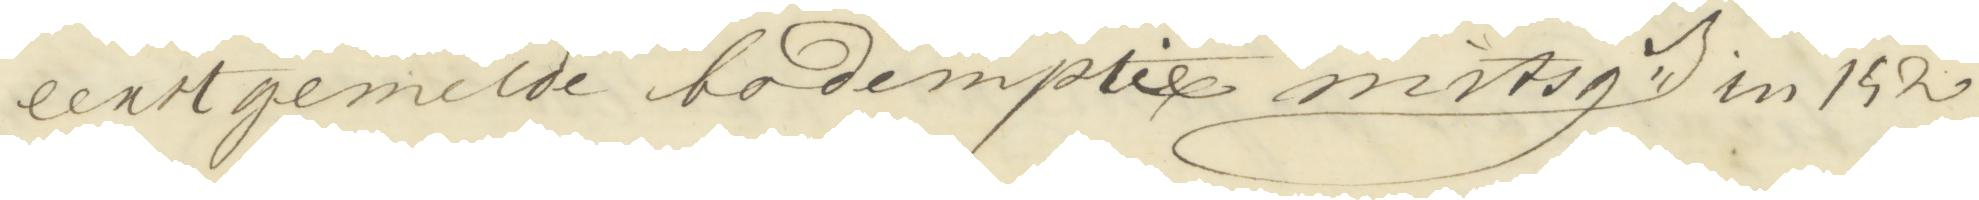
eerstgemelde bodemptie mitsg„s in 152
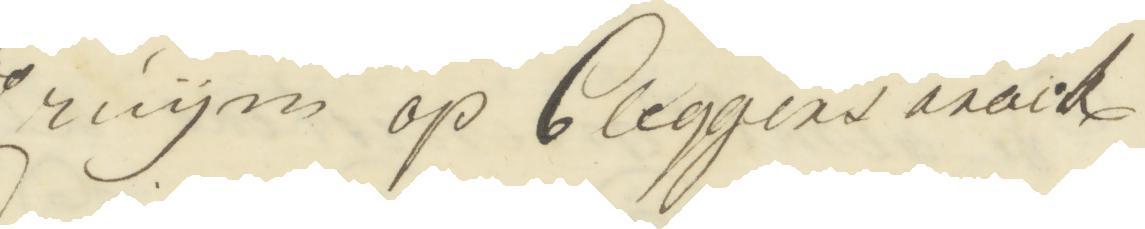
Kann: off 6 ¾ p„r C„to ruijm op 6 leggers arack
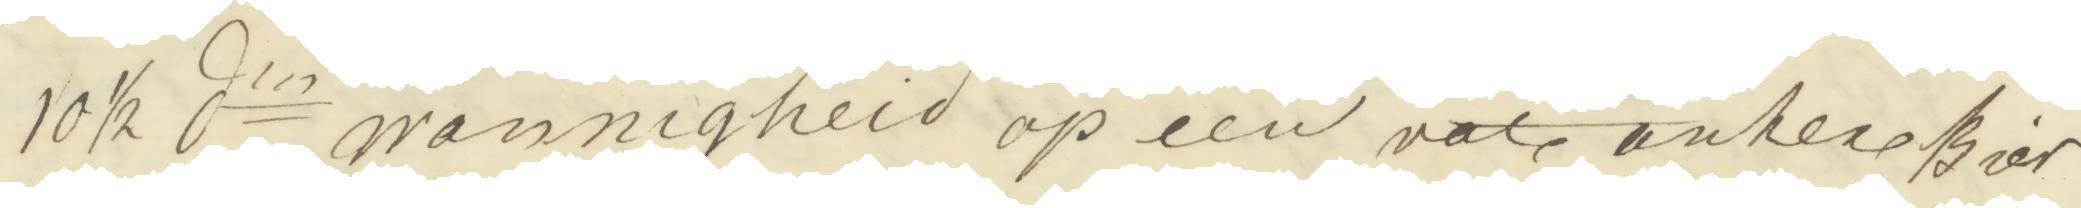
10½ d=m wannigheid op een vat anker Bier
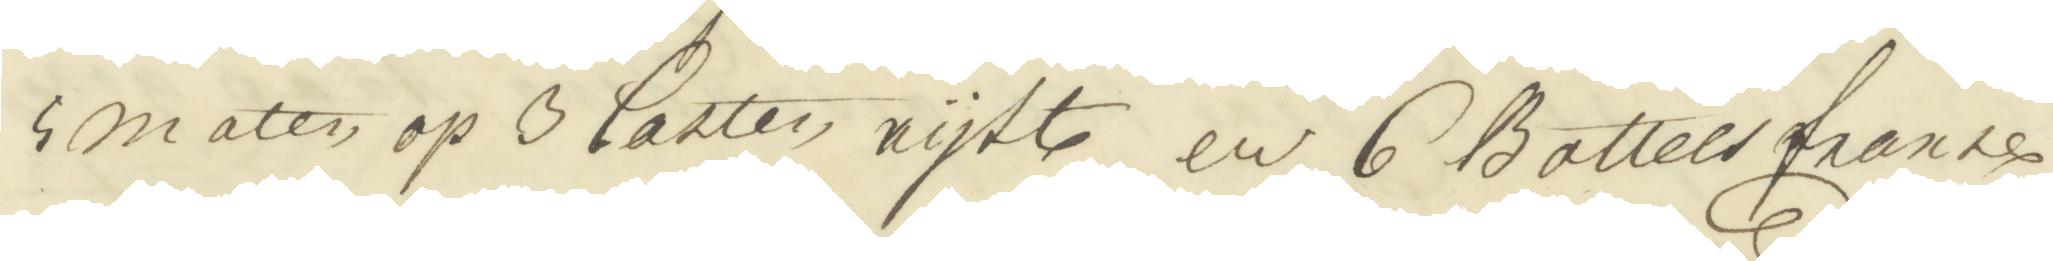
5 maten op 3 lasten rijst en 6 Bottels franse
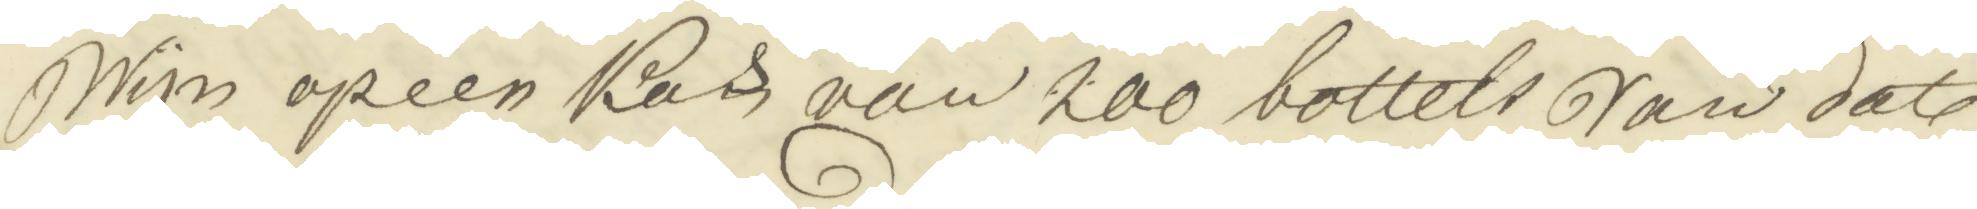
wijn op een kas aan 200 bottels van dat
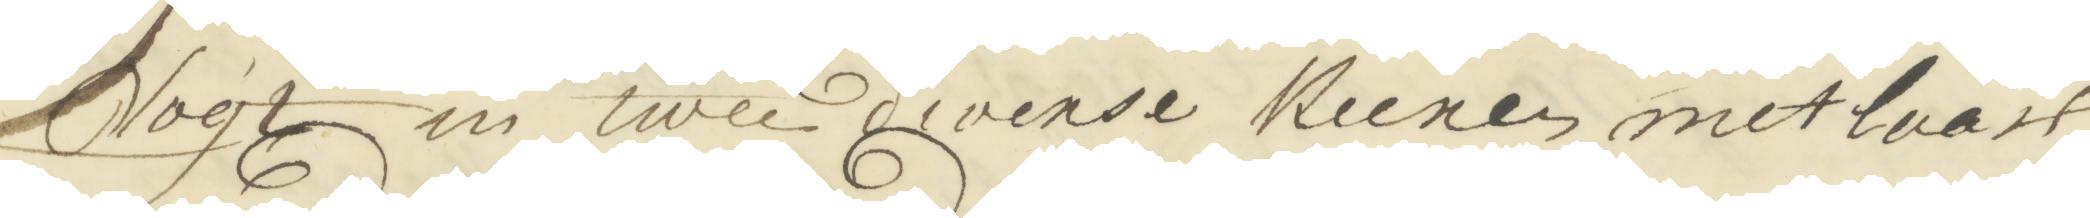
Vogt in twee diverse keeren met laast
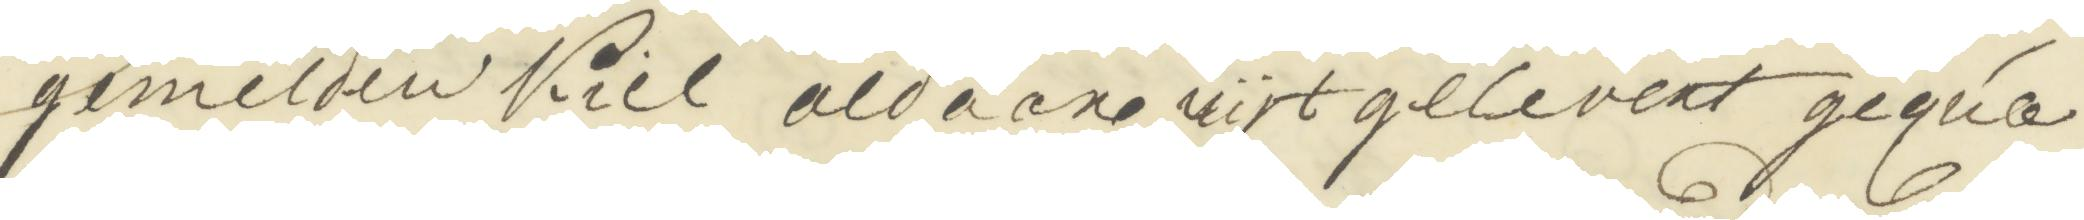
gemelden kiel aldaar uijtgelevert gequa
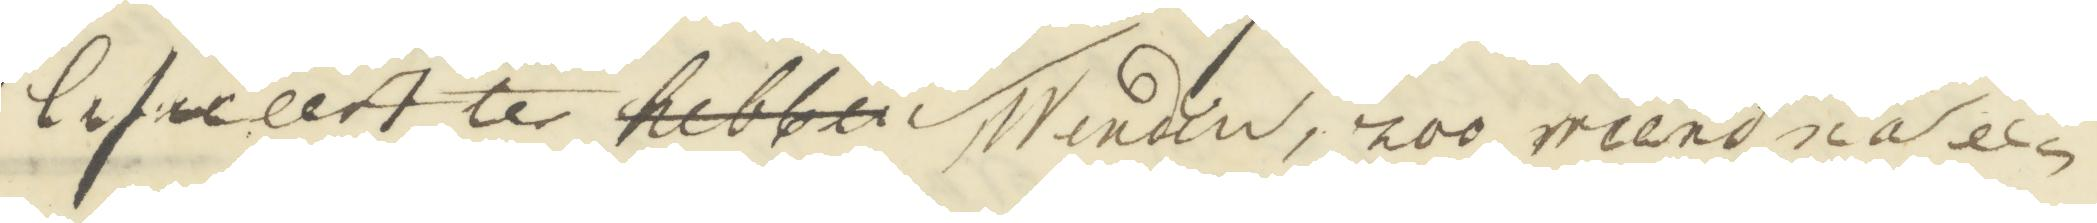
lificeert te hebben, werden, zoo wierd na een
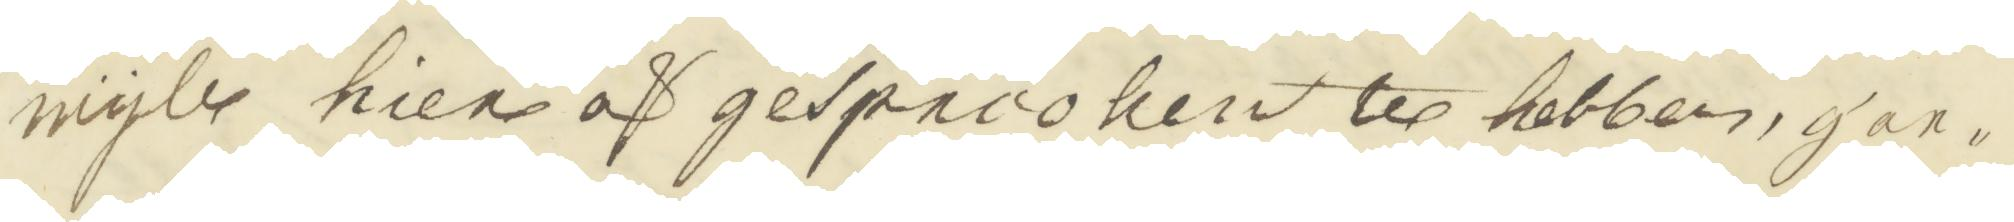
wijle hier over gesprooken te hebben, g’ar„
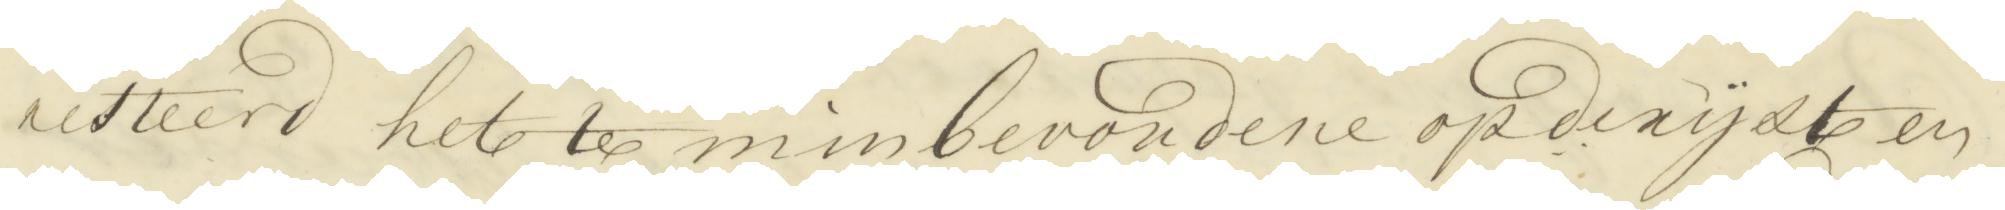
resteerd het te min bevondene op de rijst en
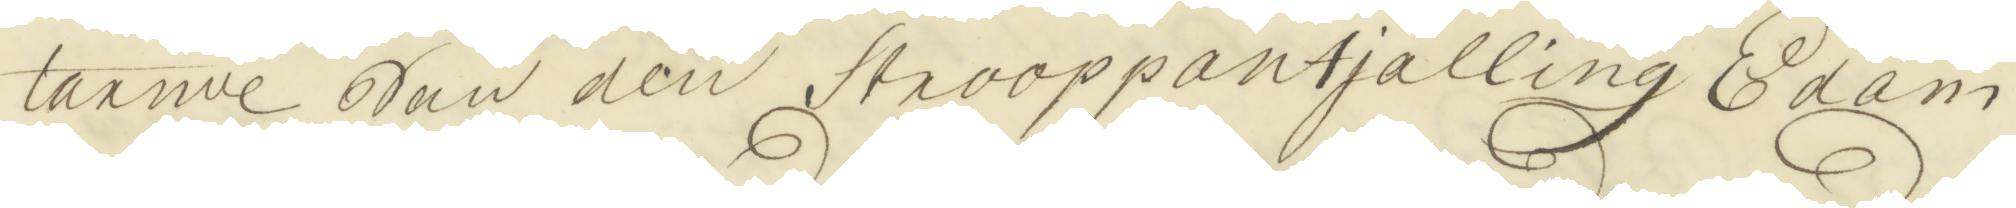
tarwe dan den strooppantjalling Edam
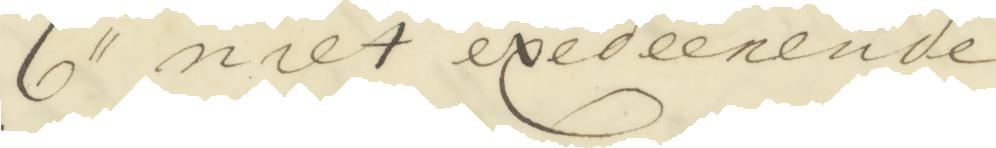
als de gepermitteerd Pr C„nt niet exedeerende
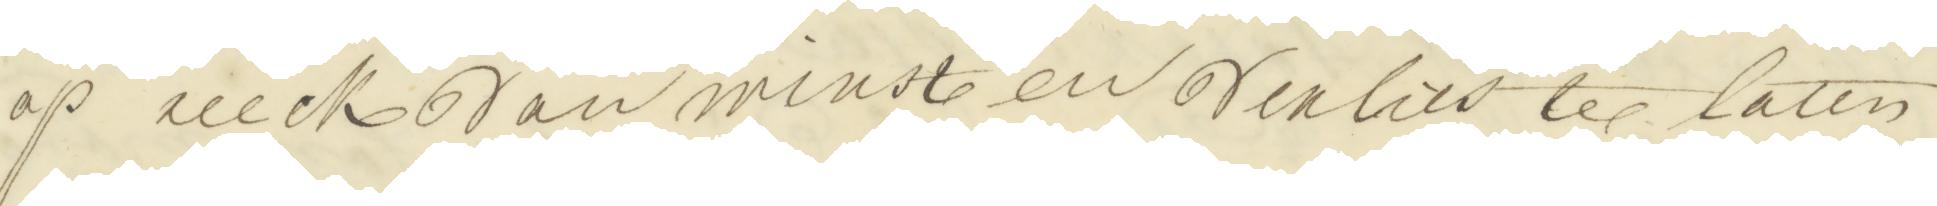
op reeck van minst en verlies te laten
